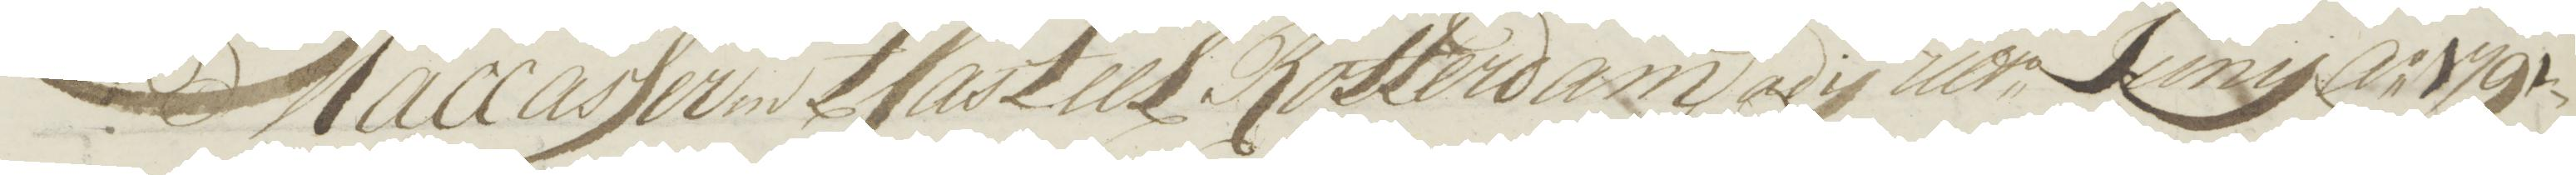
Maccasser in 't Casteel Rotterdam adij ult„o Iunij a„o 1791–
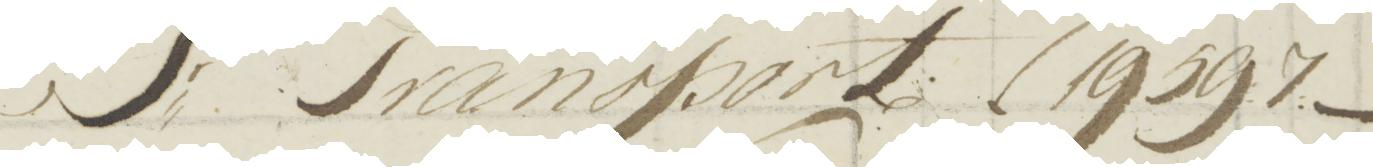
P„r Transport ƒ1959:7:—
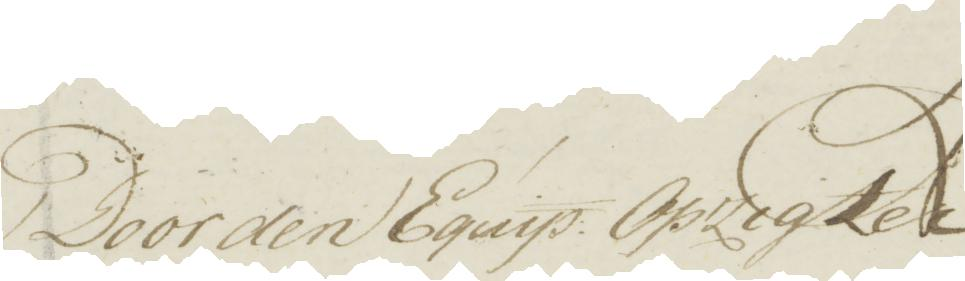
Door den Equip: Opzigter
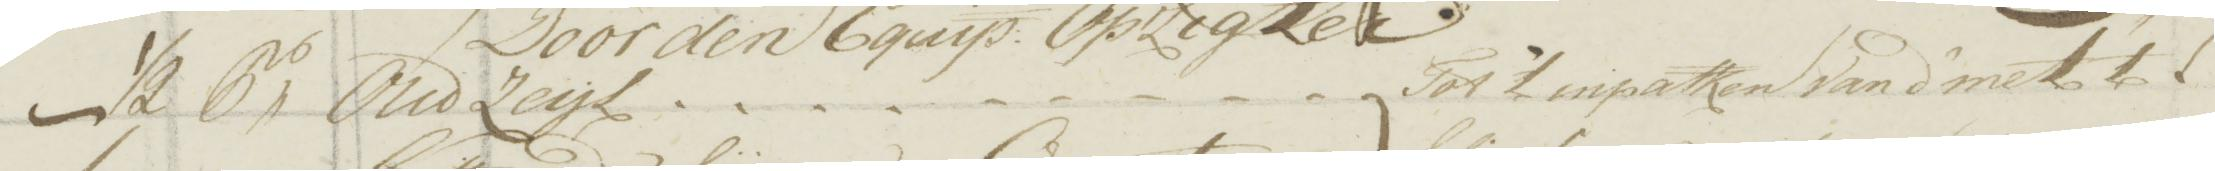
—½ P„s Oud zeijl - - - - - - - - - Tot 't inpakken van d' met 't ƒ
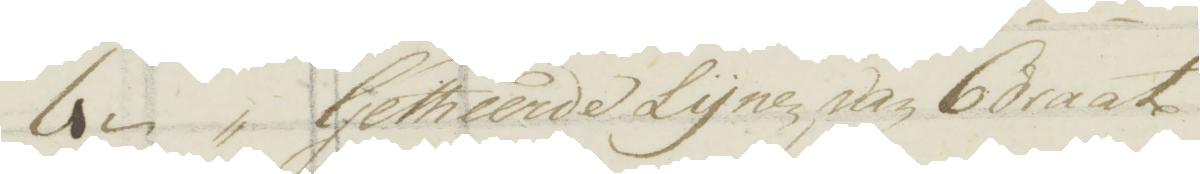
4— „ Getheerde Lijnen van 6 draat
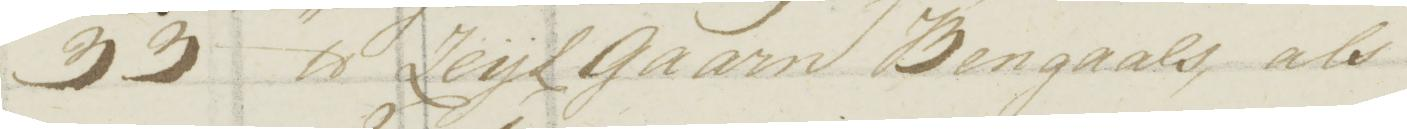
33 lb zeijl gaarn Bengaals als
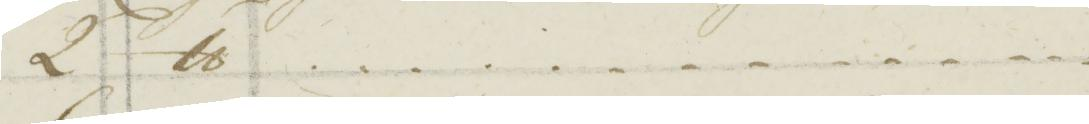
2 lb . . . . . - - - - - - - -
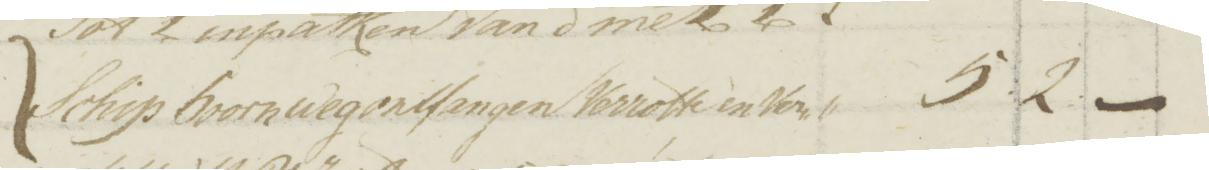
schip hoornweg ontfangen verrotte en ver„ 5: 2: —
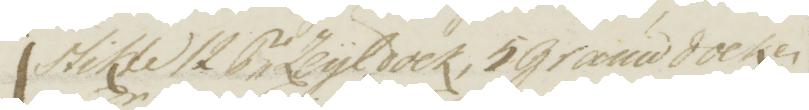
stikte 12 P„s zeijldoek, 5 grauw doeken
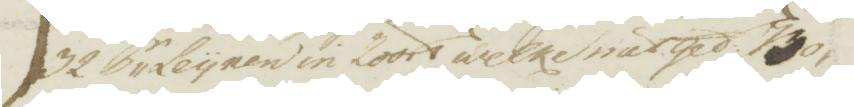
32 p„s Leijnen in zoort welke nat ged: Bo,
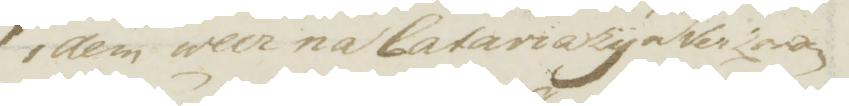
,dem weer na batavia zijn verzonden
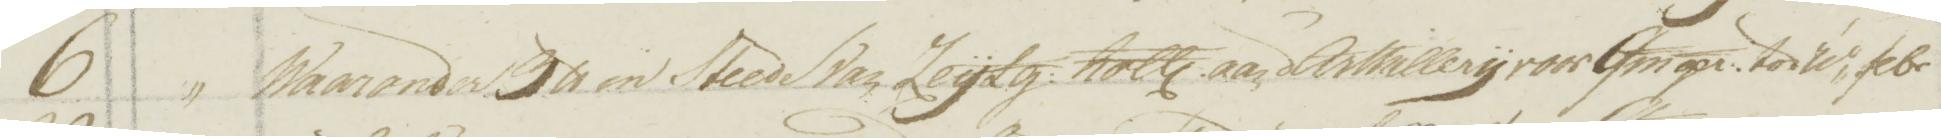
6 „ Waaronder 3lb in steeds van zeijl g: hollc aan d'arttillerij voor 6/m ger: tot u„o febr
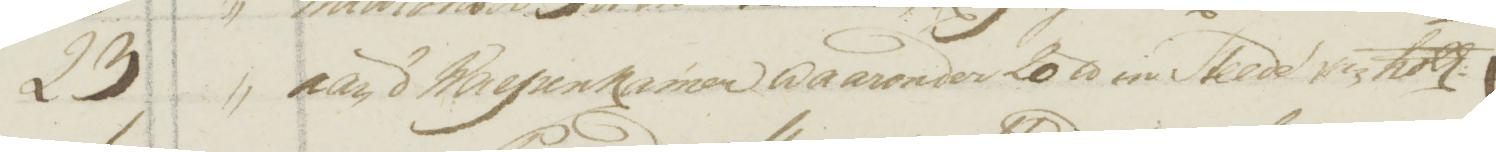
23 „ aan d'Wagenkamer waaronder 20 lb in steede van holc:
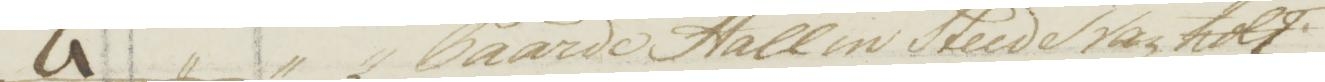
4 „ „ „ Paarde stall in steede van holc:
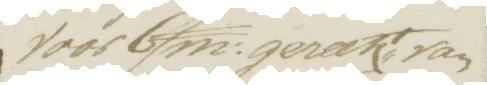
voor 6/m: gereek„t van
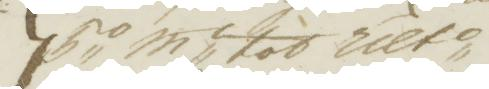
P„o m„t tot ult„o
